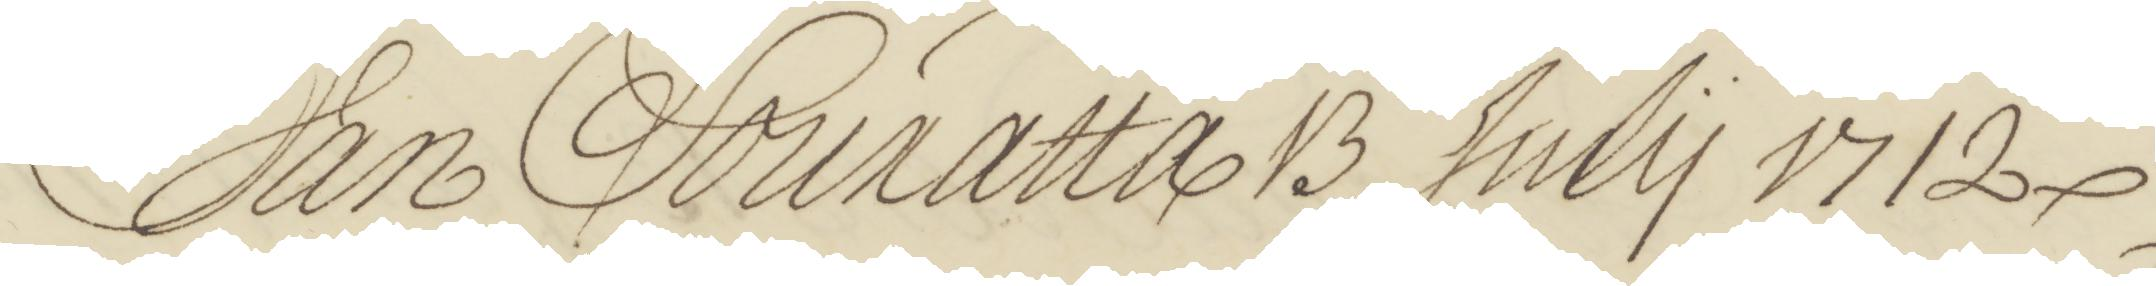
Van Souratta 13de Julij 1712
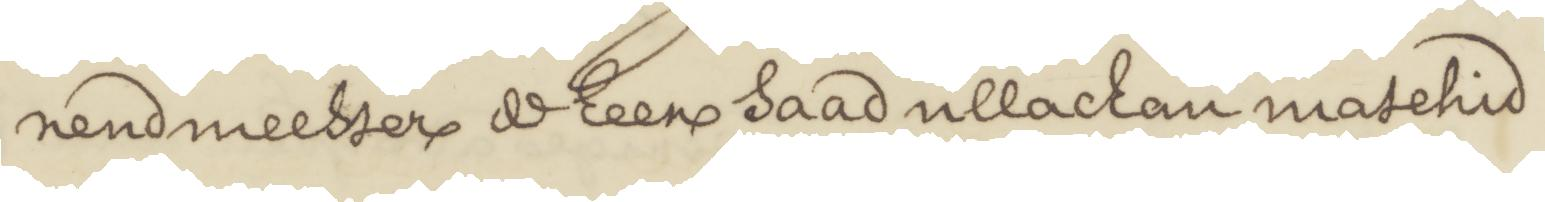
rendmeester de heer saad ullachan matehid
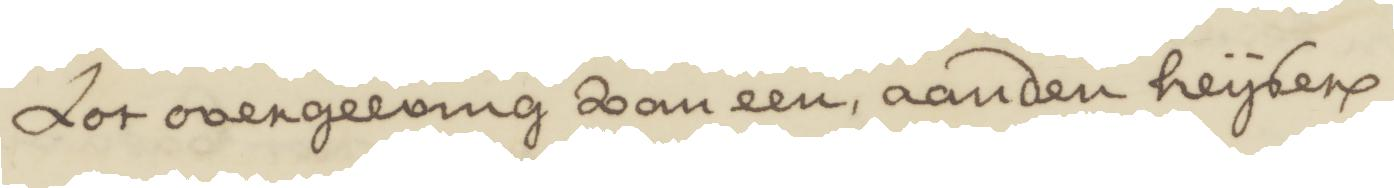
tot overgeeving van een, aan den keijser
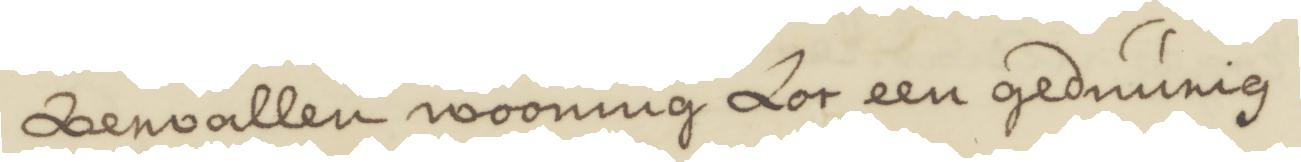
vervallen wooning tot een geduurig
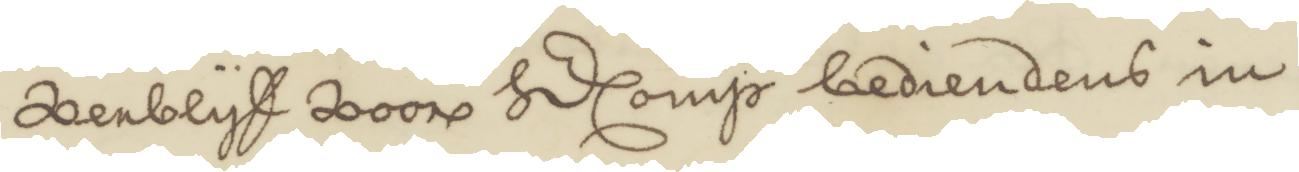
verblijf voor sE Comps bediendens in
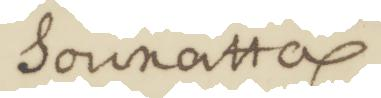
souratta
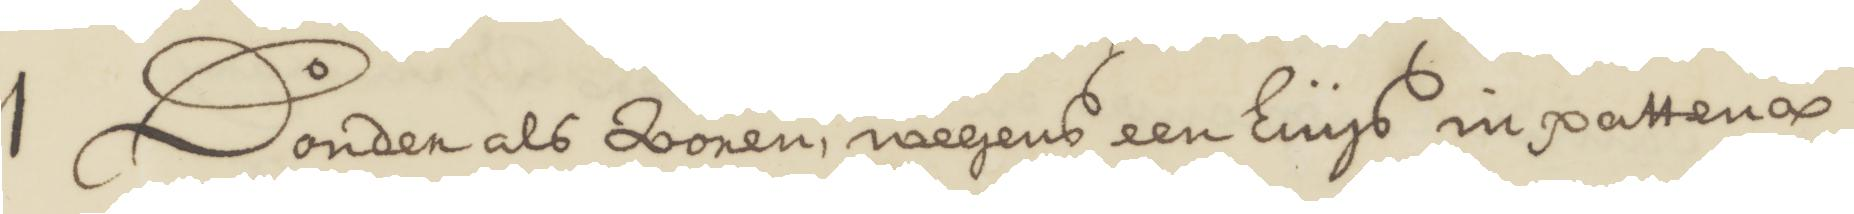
1 Donder als vooren, wegens een huijs in pattena
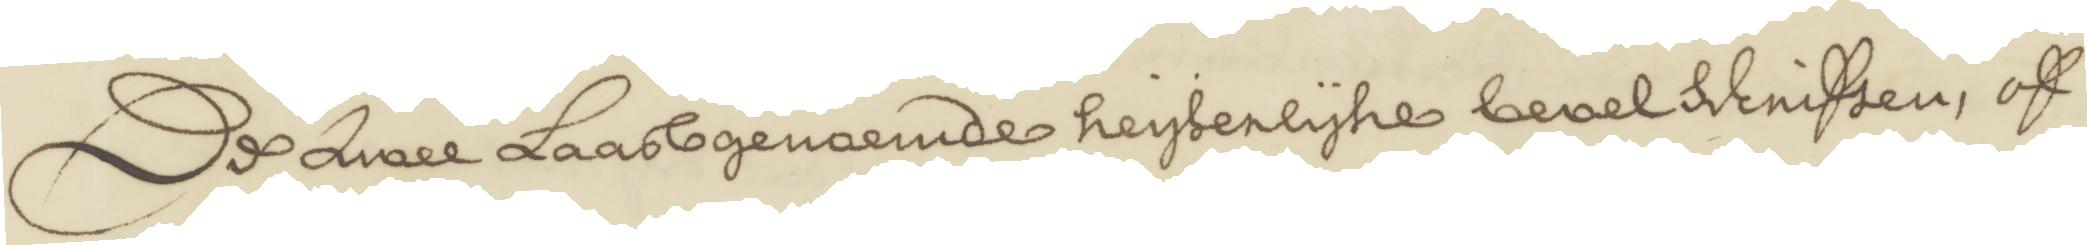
De twee Laastgenoemde keijserlijke bevelschriften, of
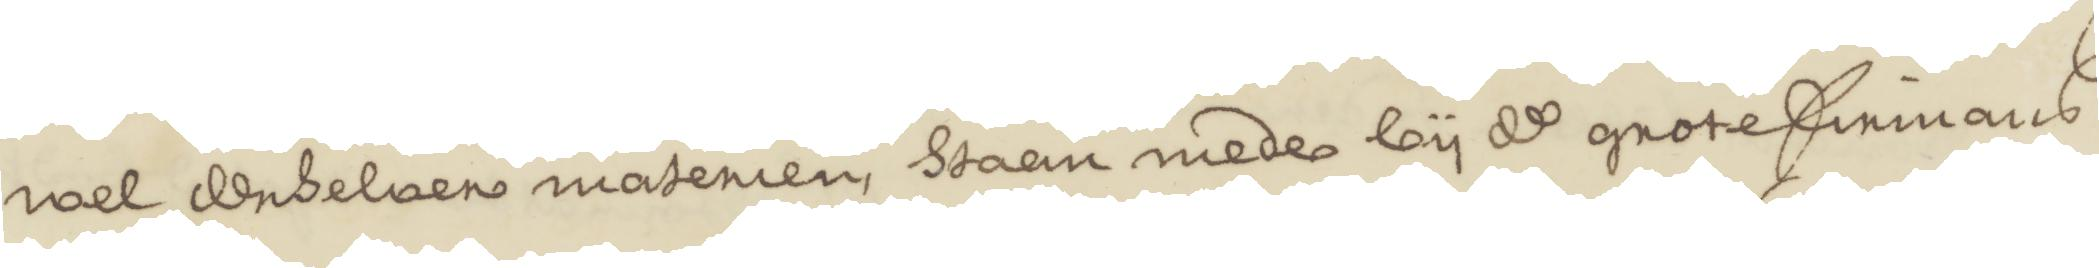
wel derselver materien, staan mede bij de grote firnans
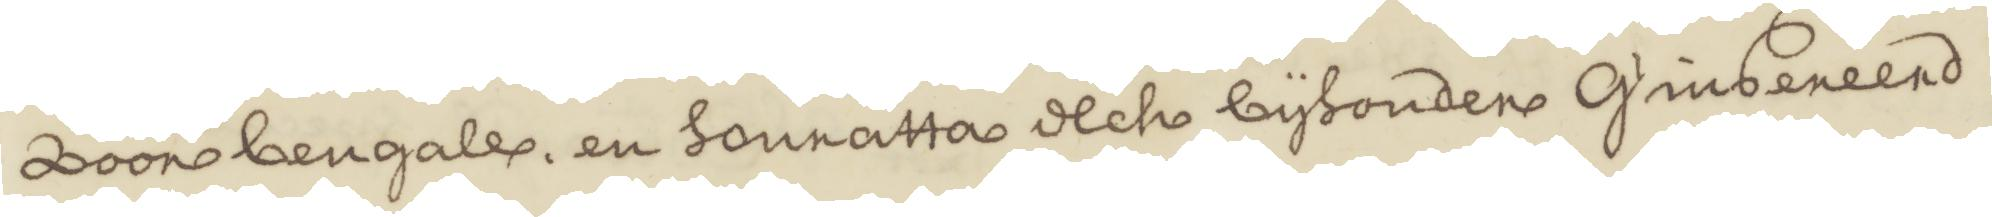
voor bengale, en souratta elck bijsonder G’insereerd
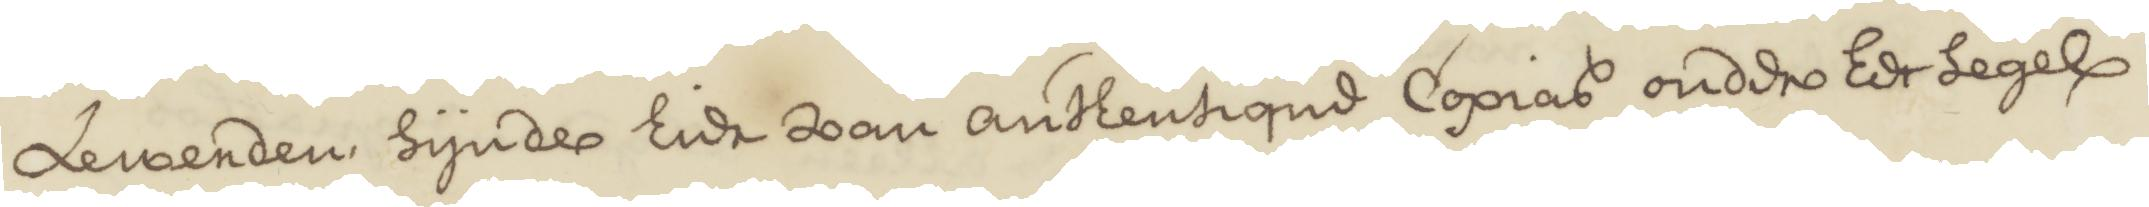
tewerden, sijnde hier van authentique Copias onder het segel
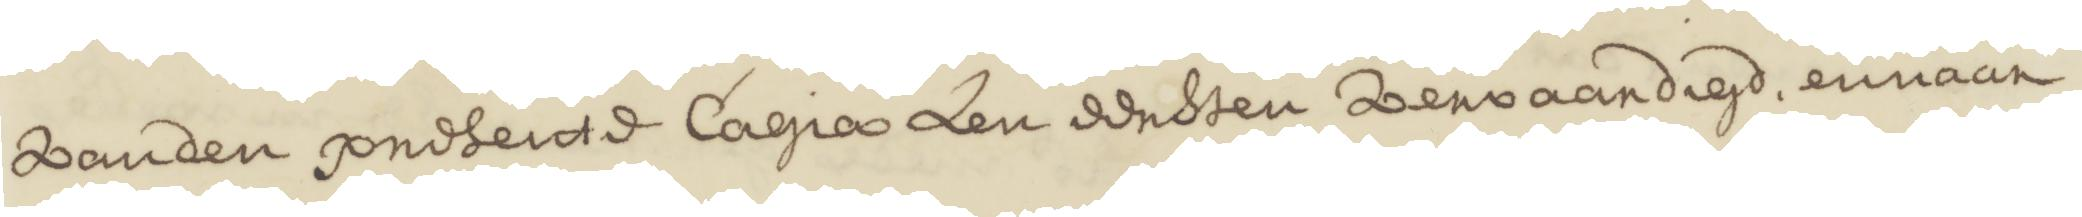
vanden presente Cagia ten eersten vervaardigd, ennaar
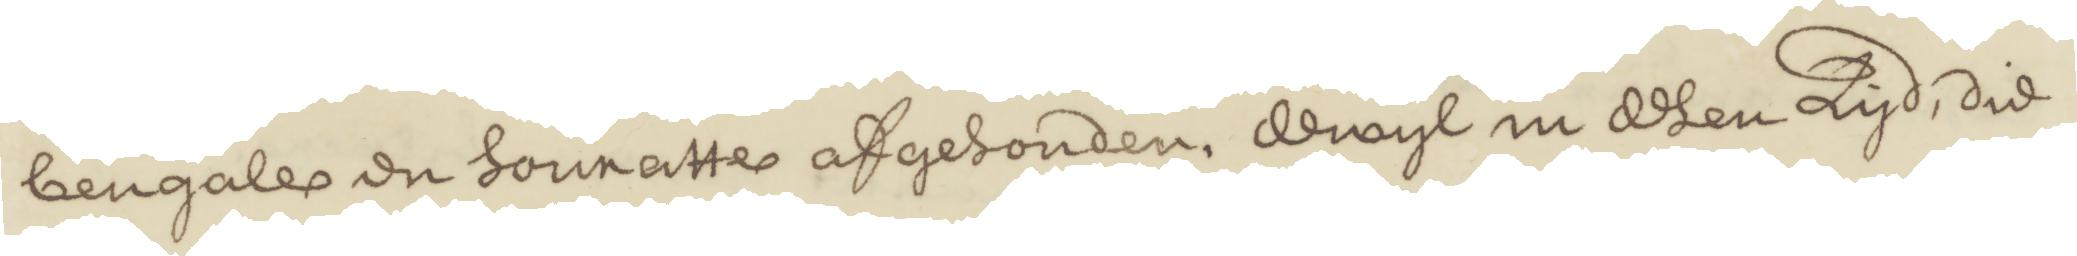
bengale en souratte afgesonden, dewijl in desen tijd, die
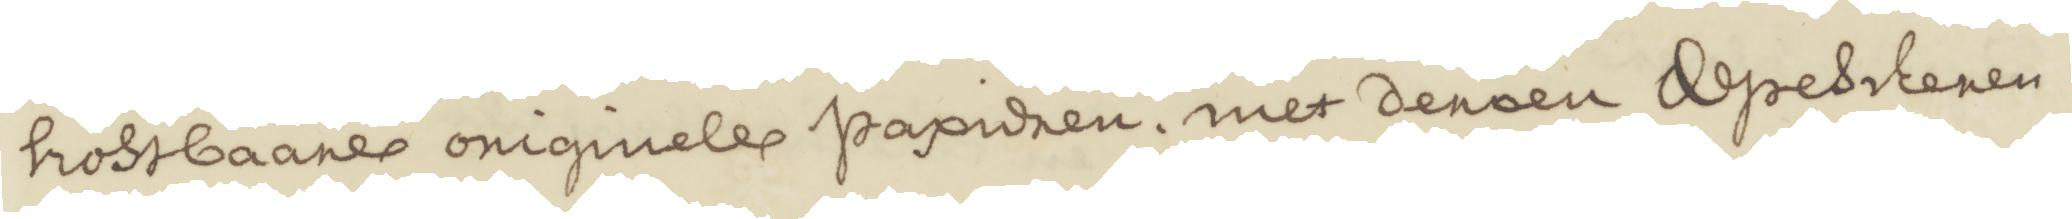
kostbaare originele papieren, niet derven depescheren
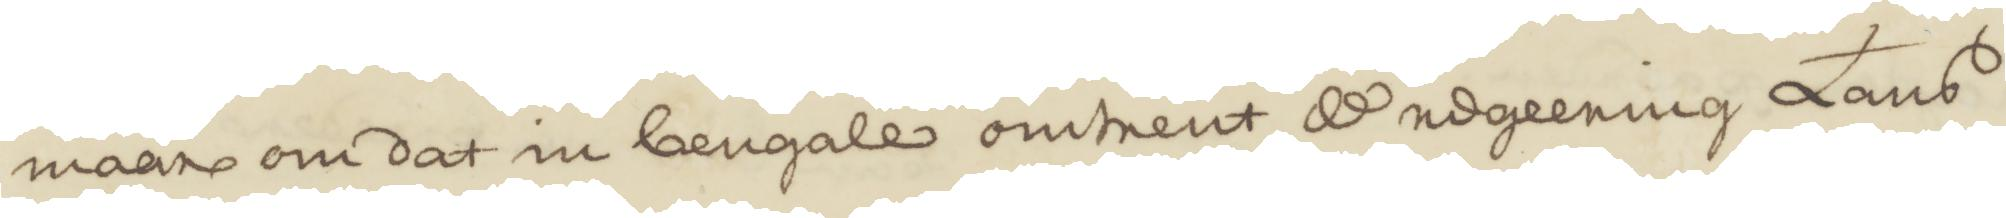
maar om dat in bengale omtrent de regeering tans
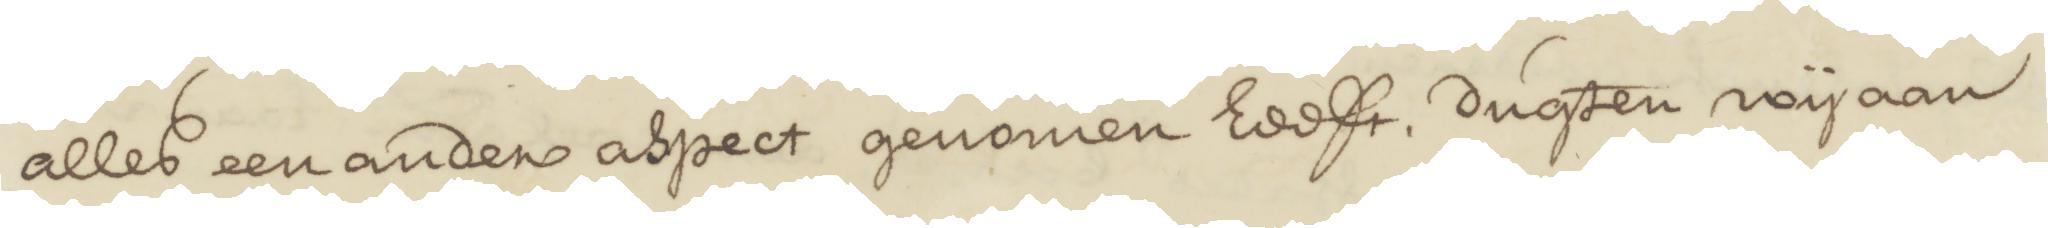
alles een ander aspect genomen heeft, dugten wij aan
